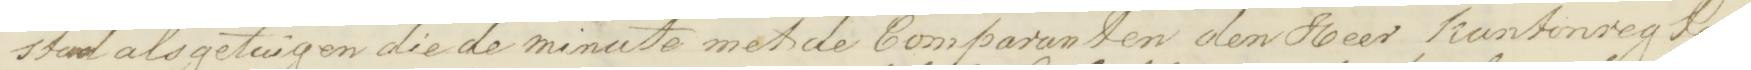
stad als getuigen die de minute met de Comparanten den Heer Kantonregter
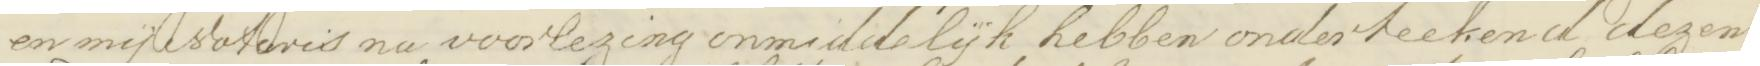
en mij Notaris na voorlezing onmiddelijk hebben onderteekend dezen
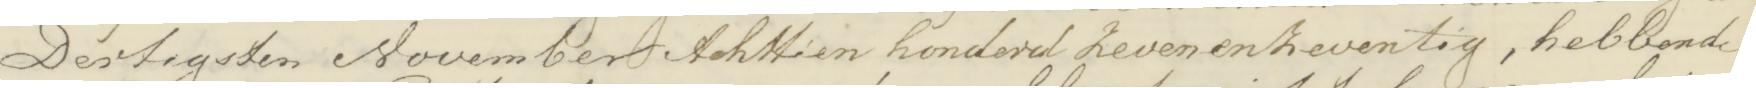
Dertigsten November Achttien honderd Zeven en Zeventig, hebbende
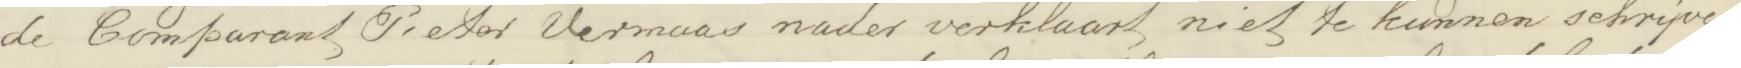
de Comparant Pieter Vermaas nader verklaart niet te kunnen schrijven
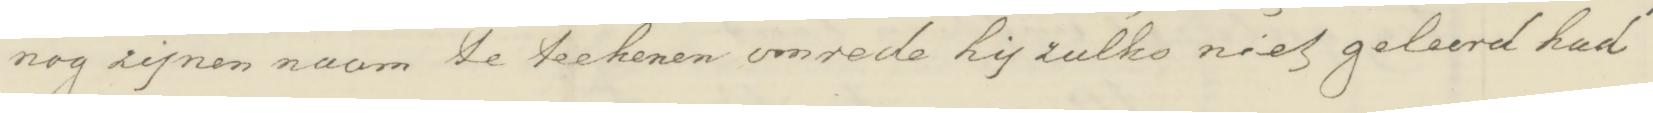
nog zijnen naam te teekenen omrede hij zulks niet geleerd had
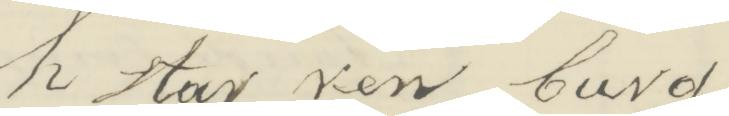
h star ken burg
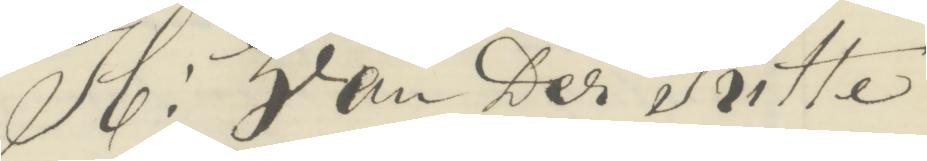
H: Van Der Putte
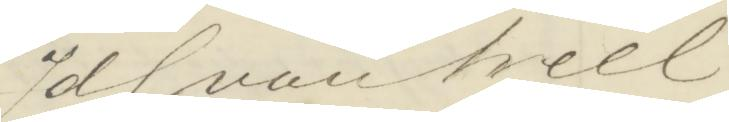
J d C van weel
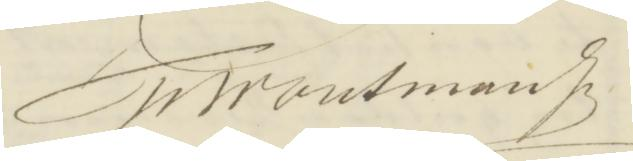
W woutman jr
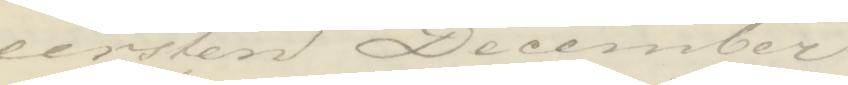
eersten December
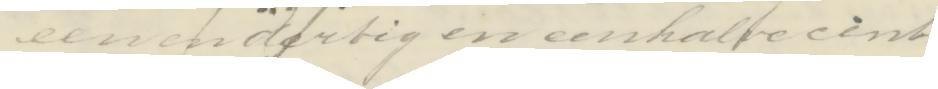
een en dertig en een halve cent
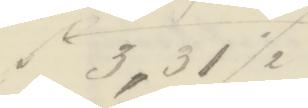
ƒ 3,31½
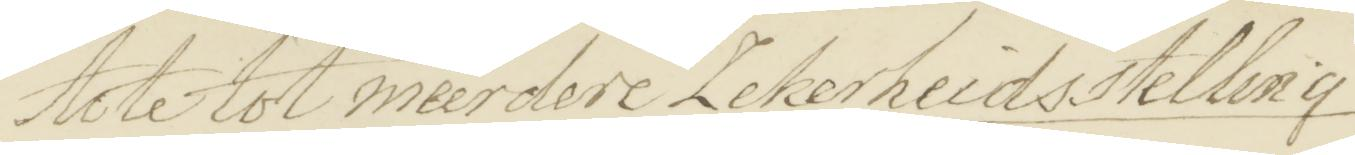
Acte tot meerdere Zekerheidsstelling
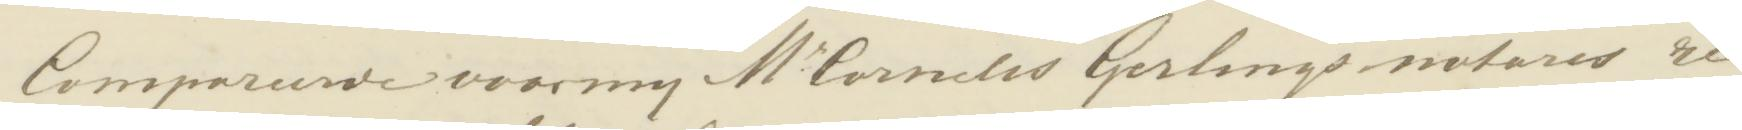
Compareerde voor my M:r Cornelis Gerlings, notaris re
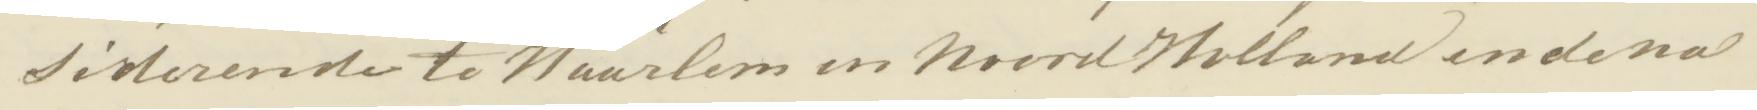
siderende te Haarlem in Noord Holland en de na
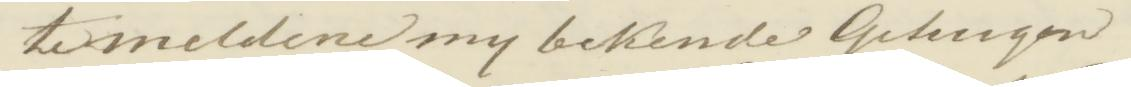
te meldene my bekende Getuigen
